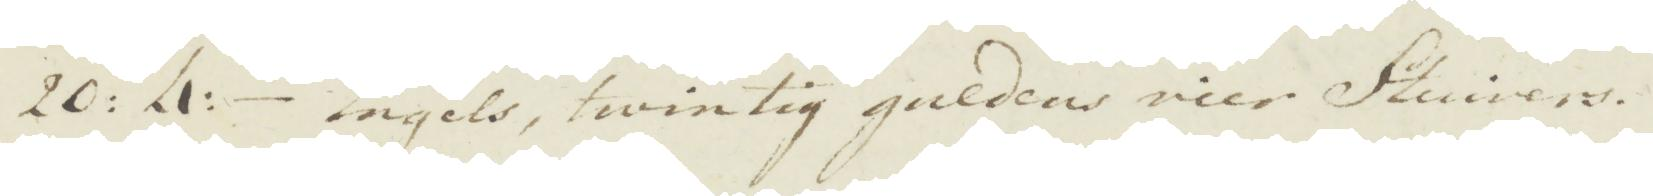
20:4:— Engels, twintig guldens vier Stuivers.
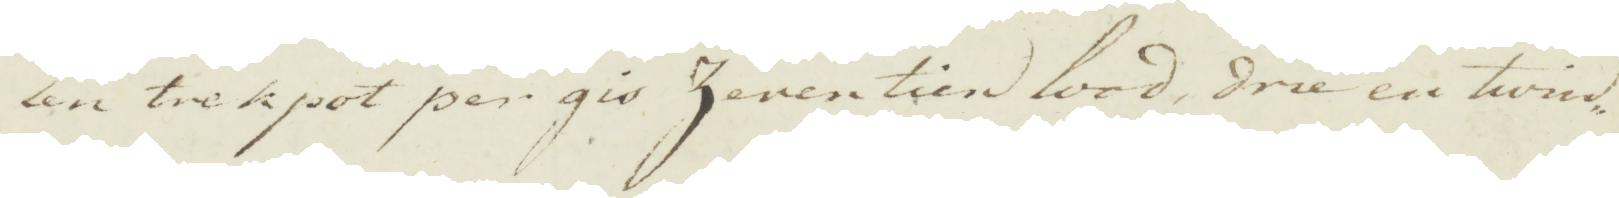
Een trekpot per gis zeventien lood, drie en twin„
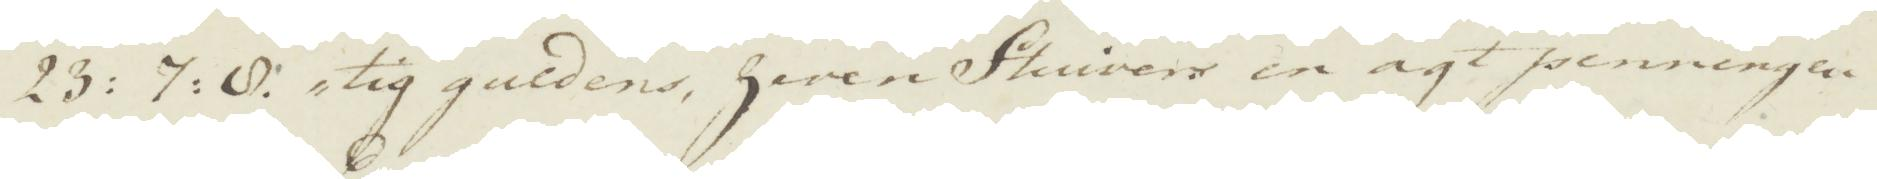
23:7:8: „tig guldens, zeven Stuivers en agt penningen
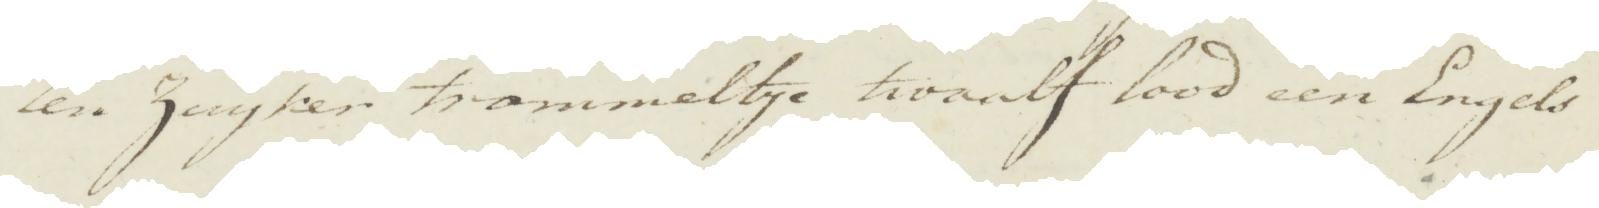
Een zuyker trommeltje twaalf lood een Engels
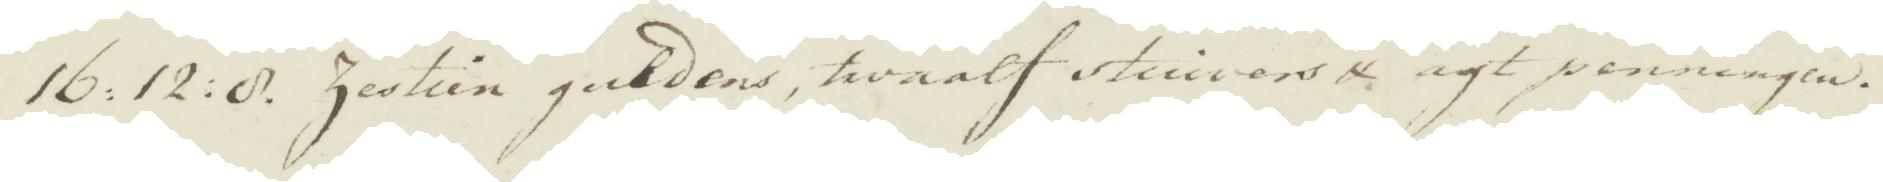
16:12:8. Zestien guldens, twaalf stuivers & agt penningen.
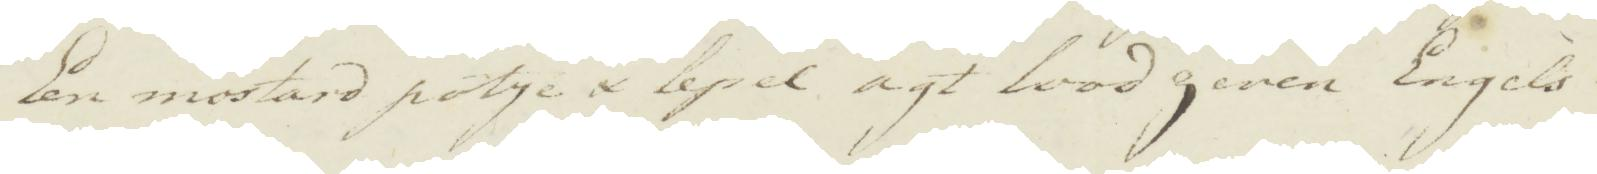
Een mostard potje & lepel agt lood zeven Engels
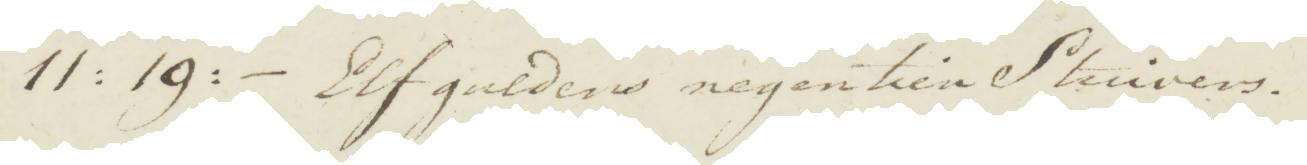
11:19:— Elf guldens negentien Stuivers.
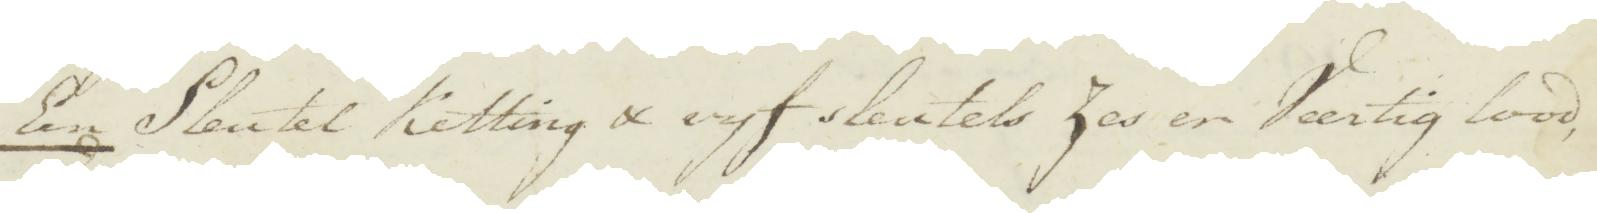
Een Sleutel ketting & vyf sleutels zes en Veertig lood,
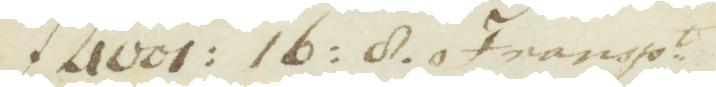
ƒ 4001:16:8. Transp„t
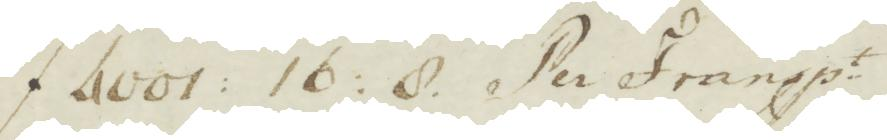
ƒ 4001:16:8. Per Transp„t
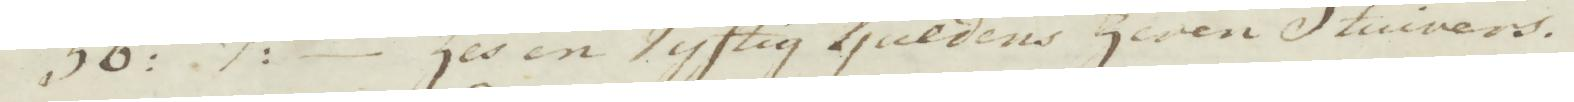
56:7:— zes en vyftig Guldens zeven Stuivers.
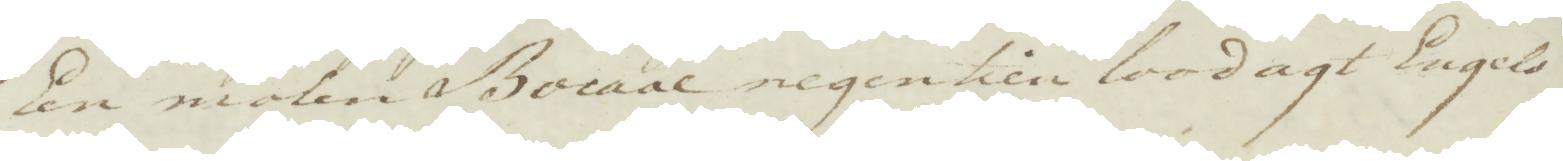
Een molen Bocaal negentien lood agt Engels
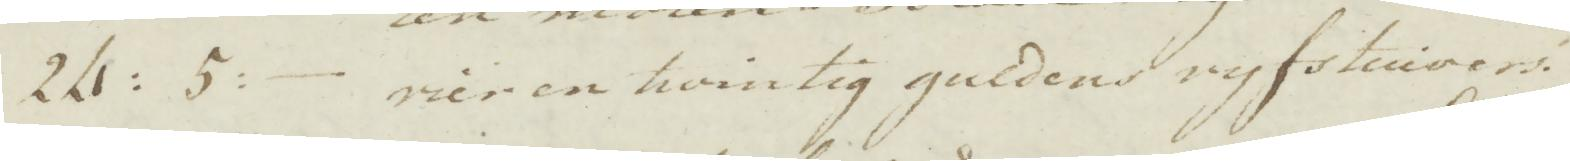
24:5:— vier en twintig guldens vyf stuivers.
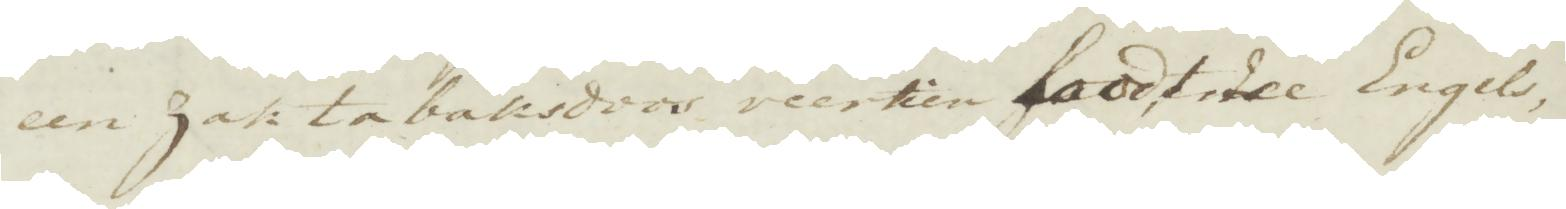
een zak tabaksdoos veertien lood, twe Engels,
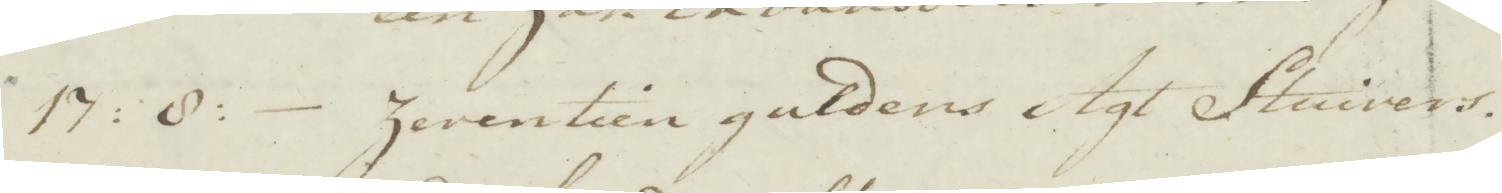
17:8:— zeventien guldens Agt Stuivers.
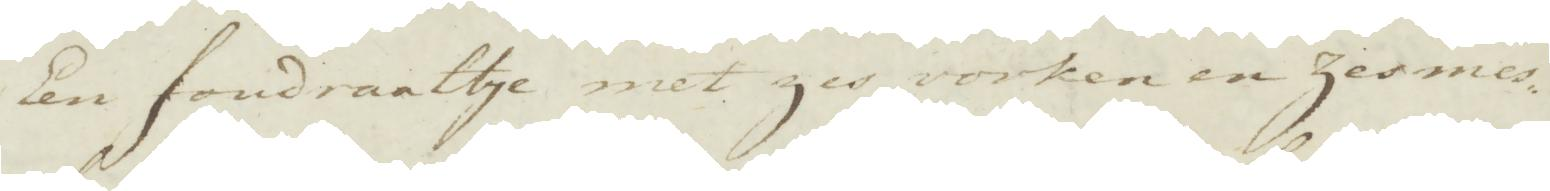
Een foudraaltje met zes vorken en zes mes„
